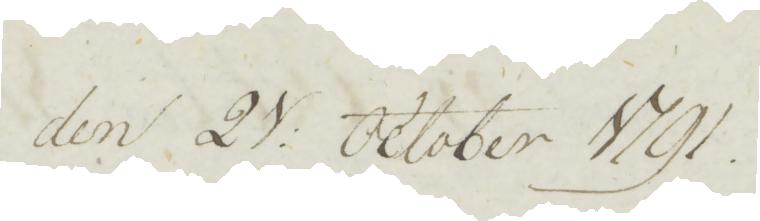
den 21: October 1791
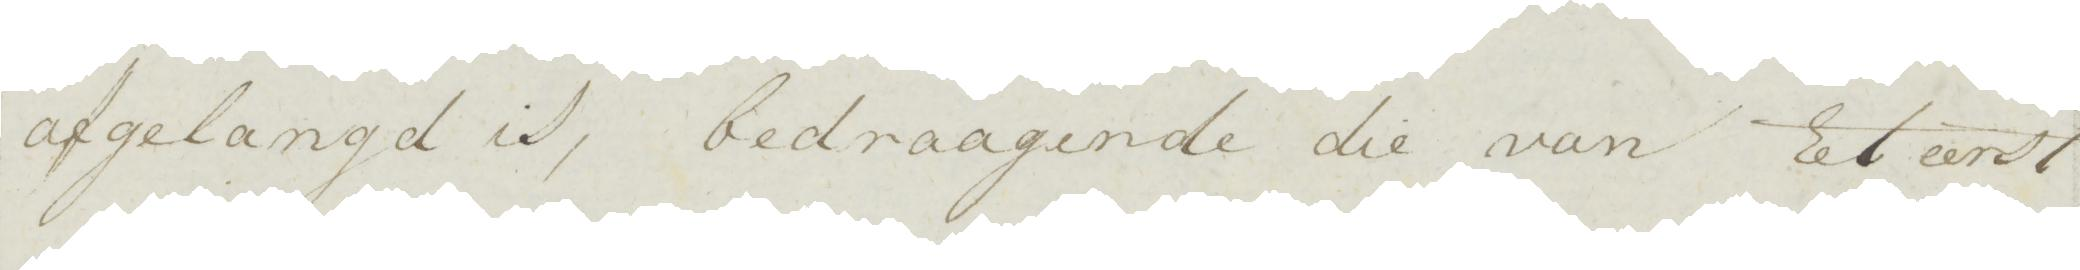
afgelangd is, bedraagende die van het eerst
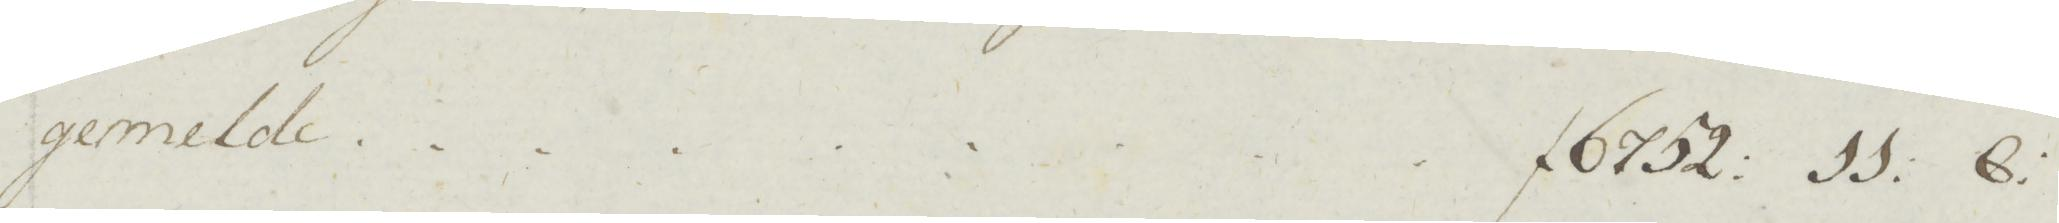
gemelde . . . . . . . . . ƒ6752: 11: 8:
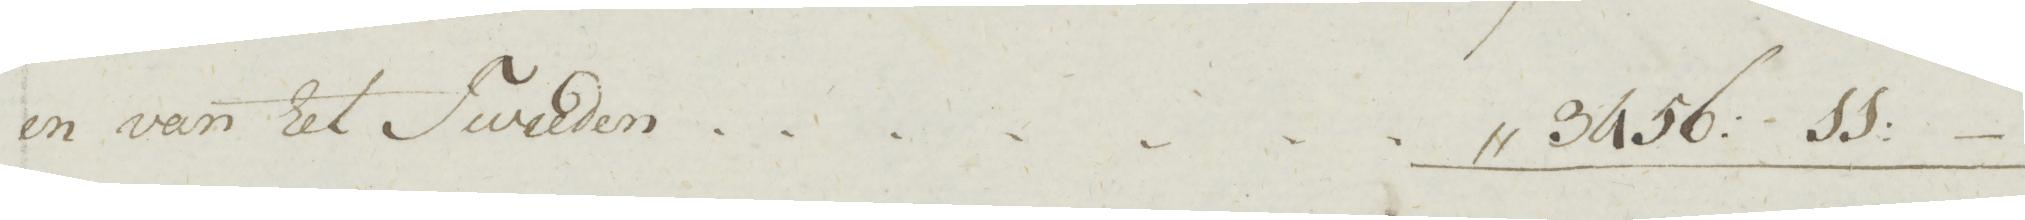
en van het Tweeden . . . . - - - „ 3456: 11: —
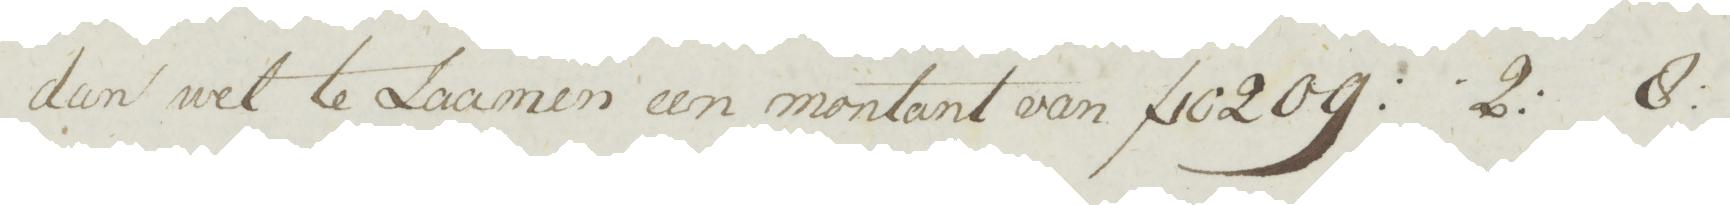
dan wel te zaamen een montant van ƒ10209: 2: 8:
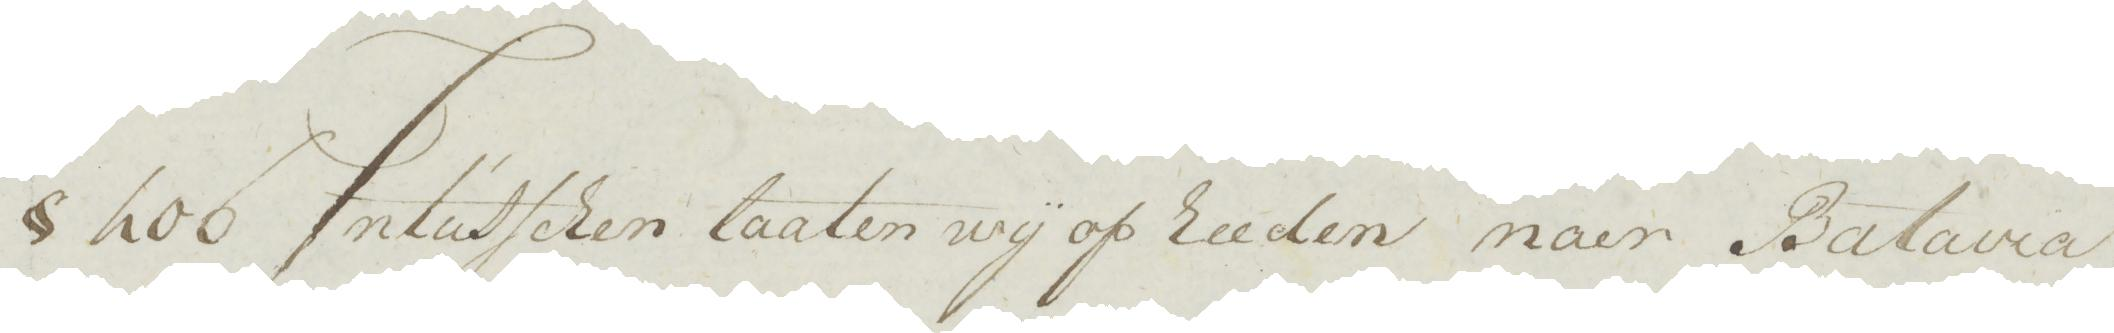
§ 406 Jntusschen laaten wij op heeden naer Batavia
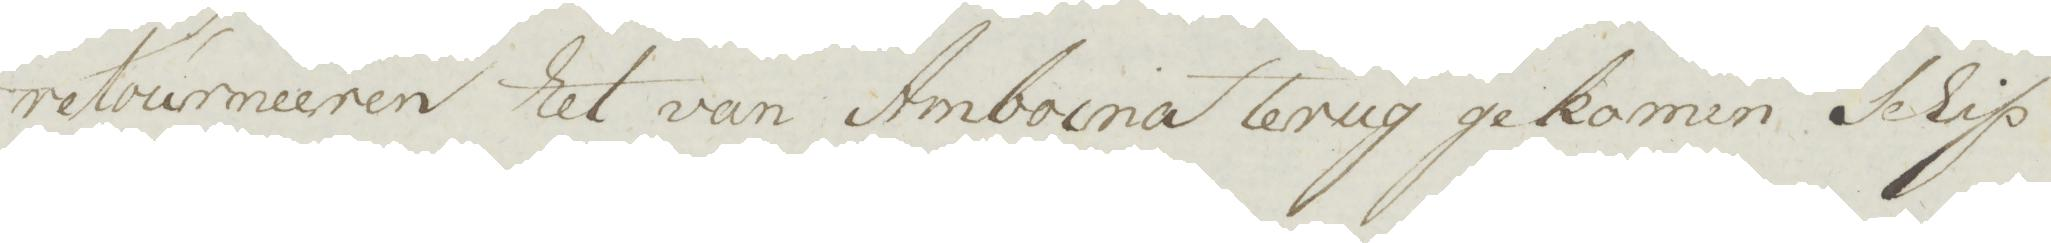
retourneeren het van Amboina terug gekomen schip
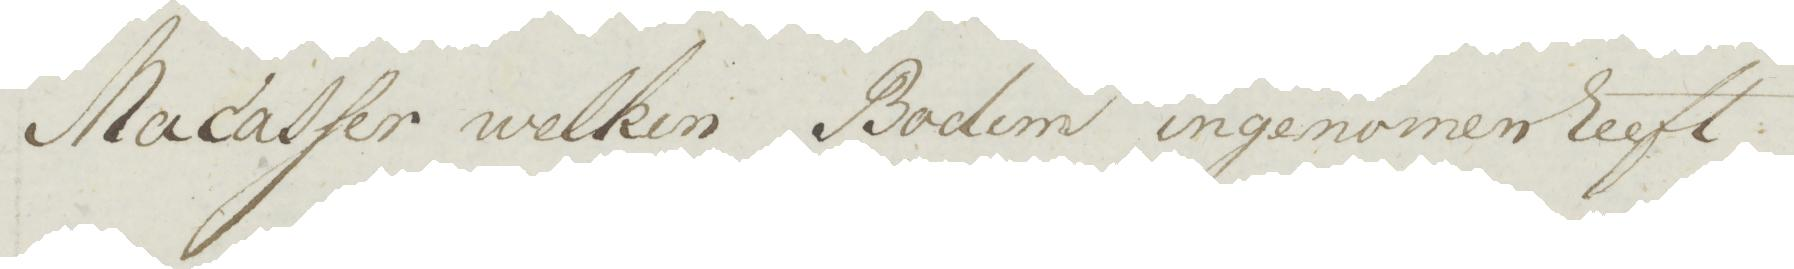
Macasser welken Bodem ingenomen heeft.
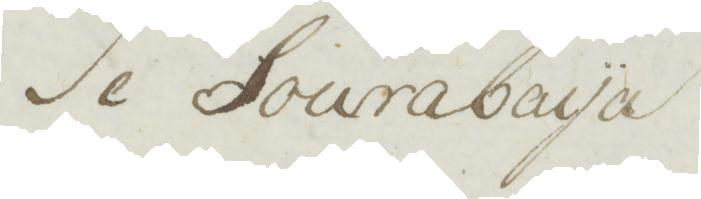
Te Sourabaija
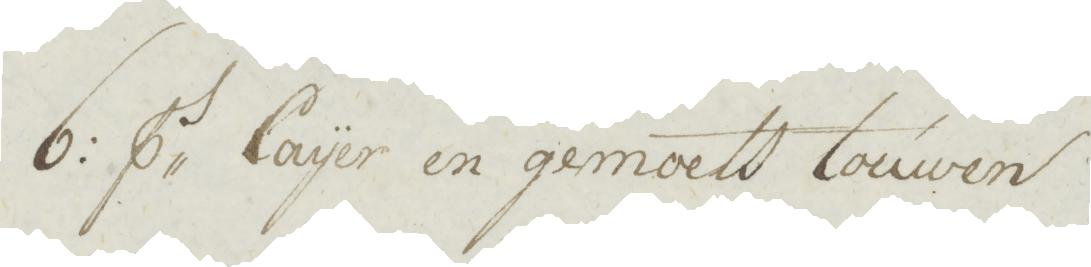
6: p„s Caijer en gemoets touwen
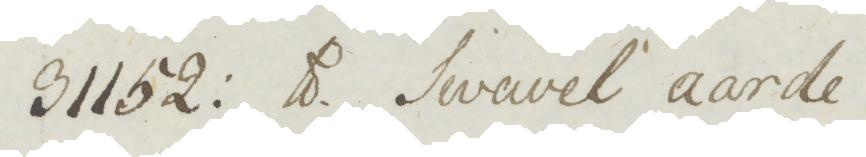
31152: lb. swavel aarde
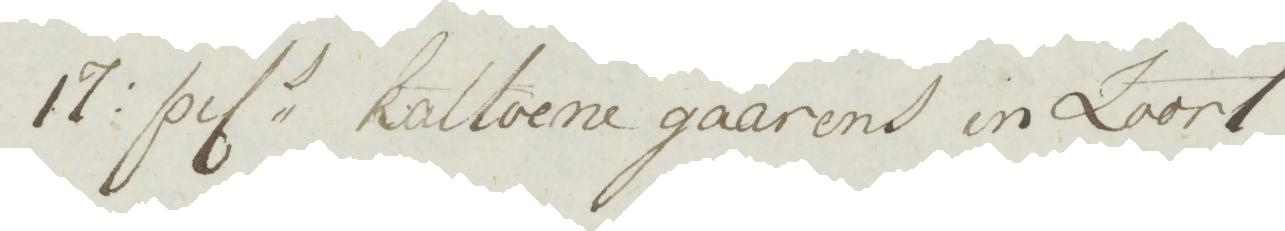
17: piC„s kattoene gaarens in zoort
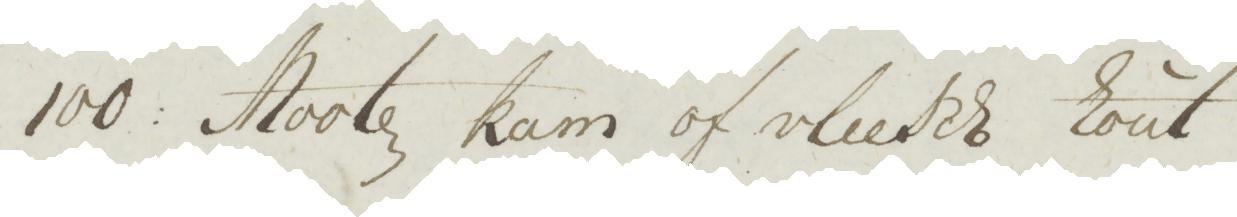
100: nooten kam of vleesch hout
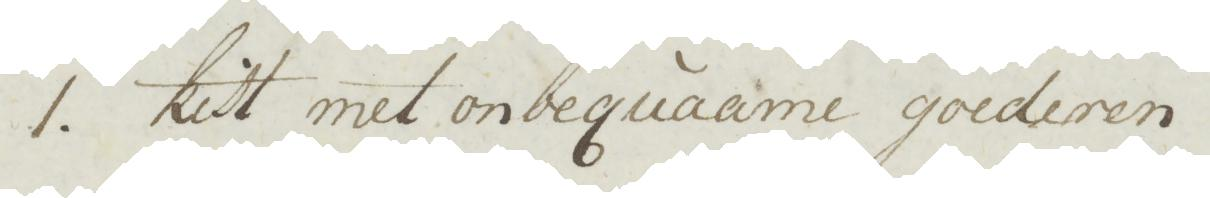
1. kist met onbequaame goederen
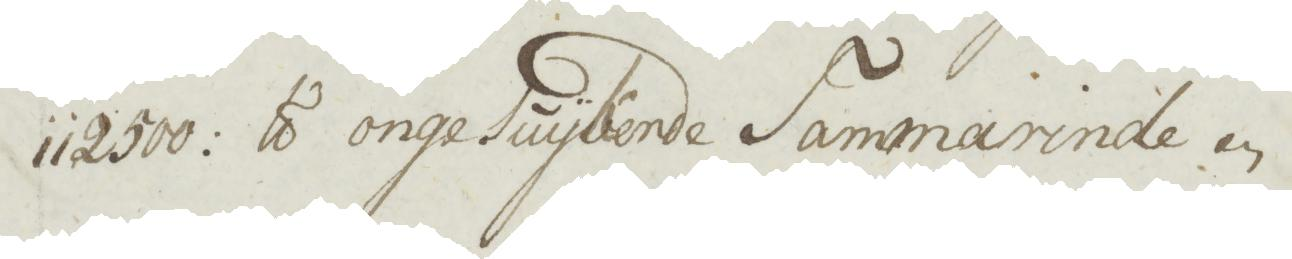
112500: lb ongesuijkerde Tammarinde en
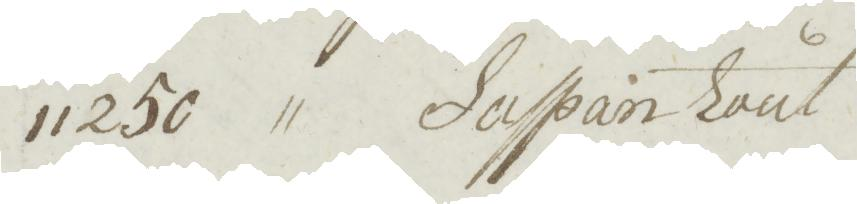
11250 „ sappan hout
